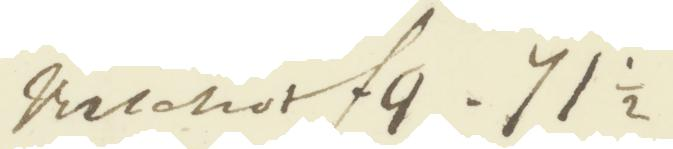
Verschot ƒ 9 . 71½
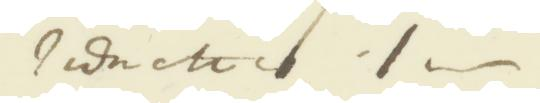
Redactie
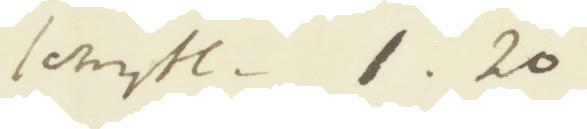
Schryfl 1. 20
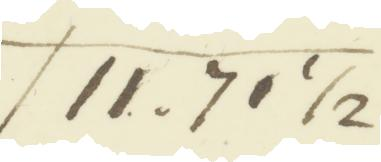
ƒ11. 71½
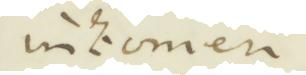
inkomen
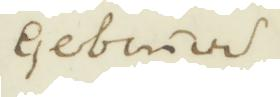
Gebouwd
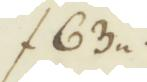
ƒ63„
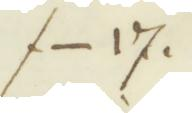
ƒ- 17.
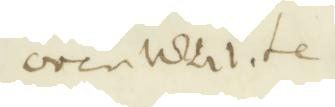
over 1841, te
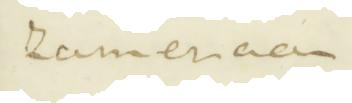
Zamen aan
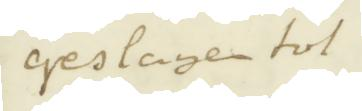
geslagen tot
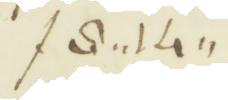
ƒ 8 „14 „
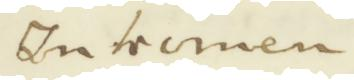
Inkomen
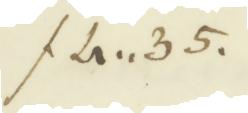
ƒ 4 „ 35.
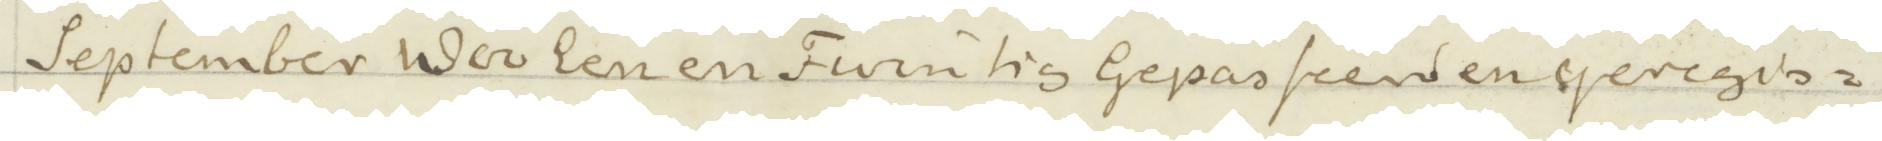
September 1800 Een en Twintig Gepasseerd en geregis=
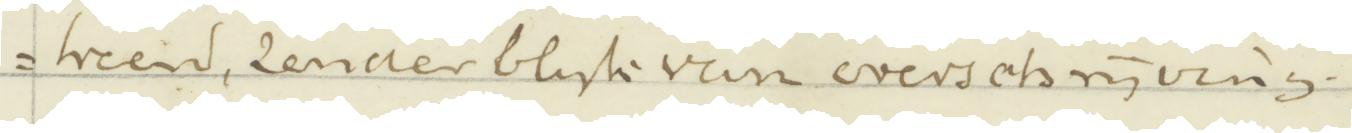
=treerd, Zonder blyk van overschrijving.
